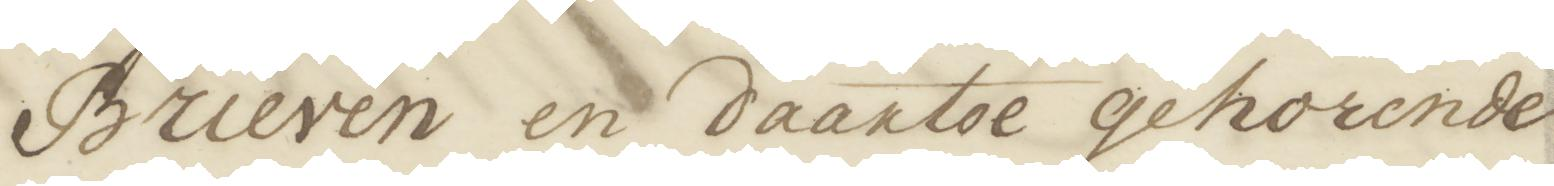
Brieven en daartoe gehorende
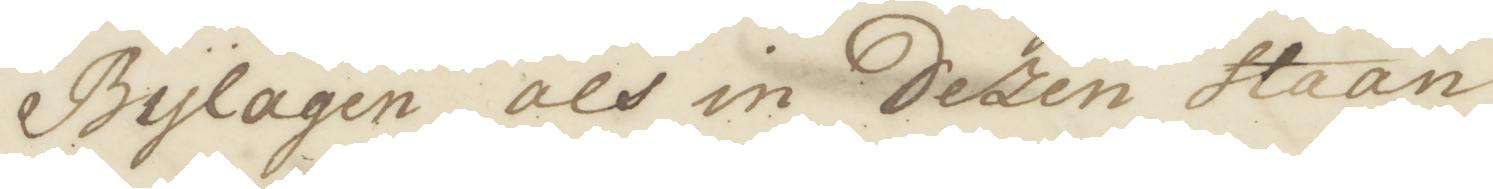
Bijlagen als in dezen staan
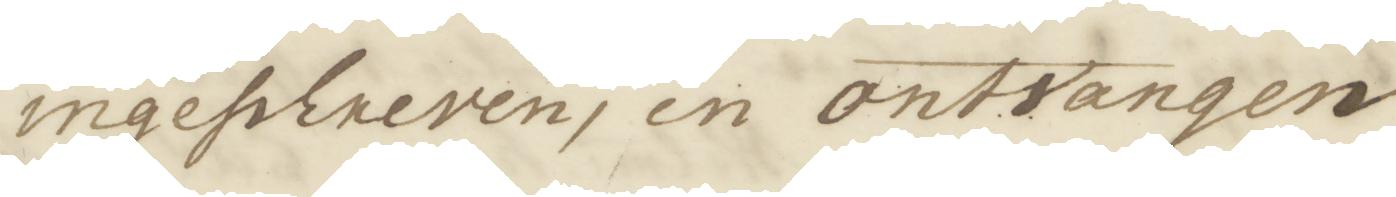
ingeschreven, en ontvangen
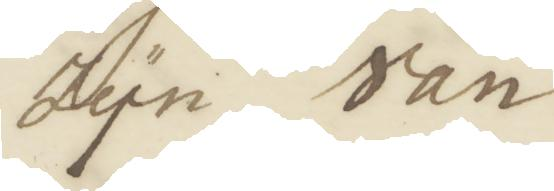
zijn van
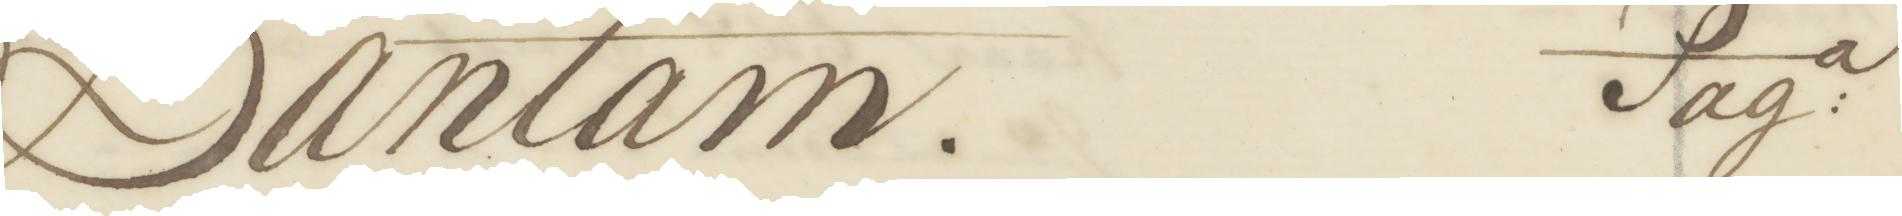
Bantam. Pag:a
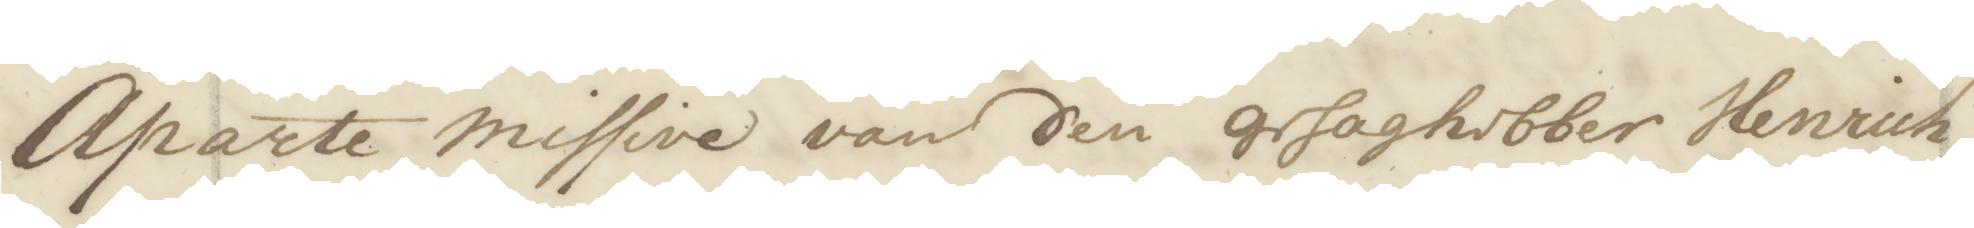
Aparte missive van den gesaghebber Henrich
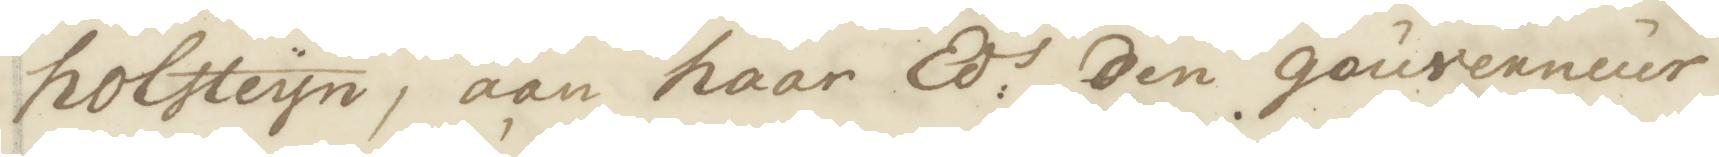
holsteijn, aan haar Ed:s den gouverneur
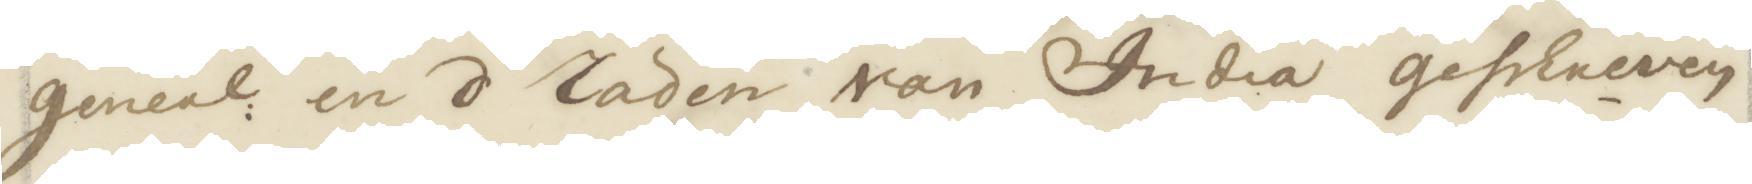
gener:l en d' Raden van India geschreven
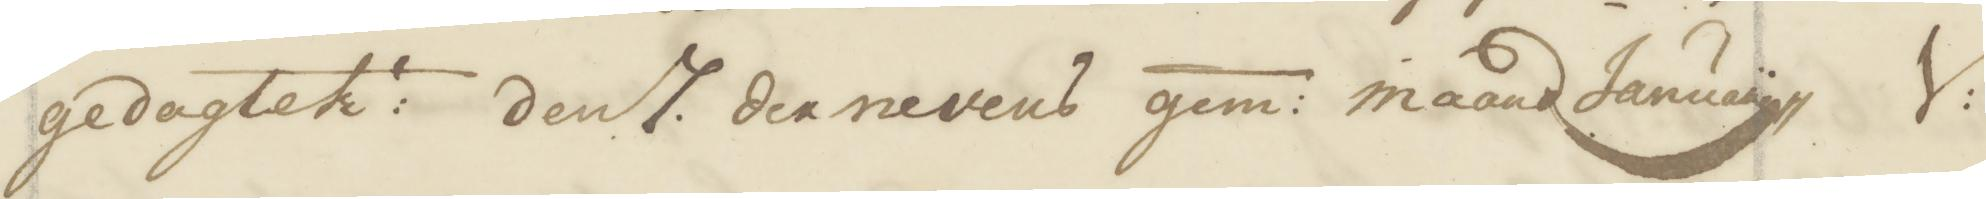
gedagtek:t den 7. der nevens gem: maand Ianuarij 1:
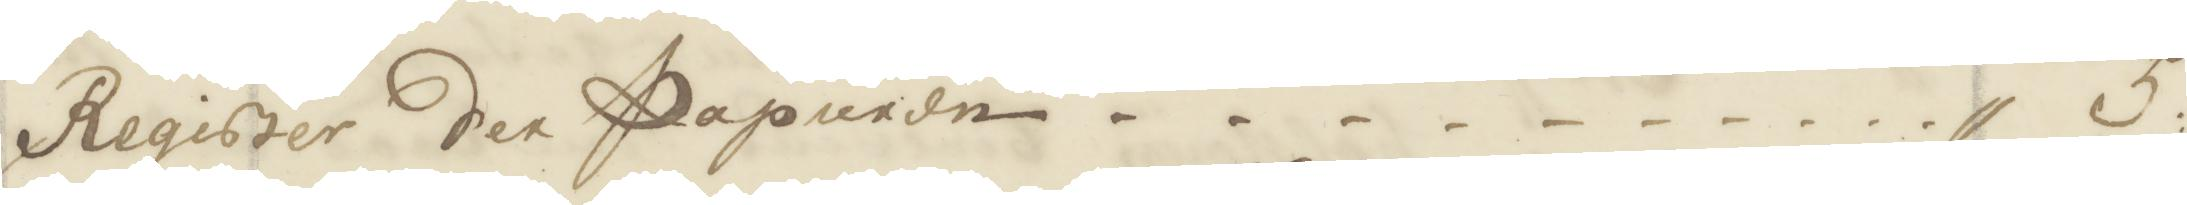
Register der Papieren - - - - - - - - - - „ 5
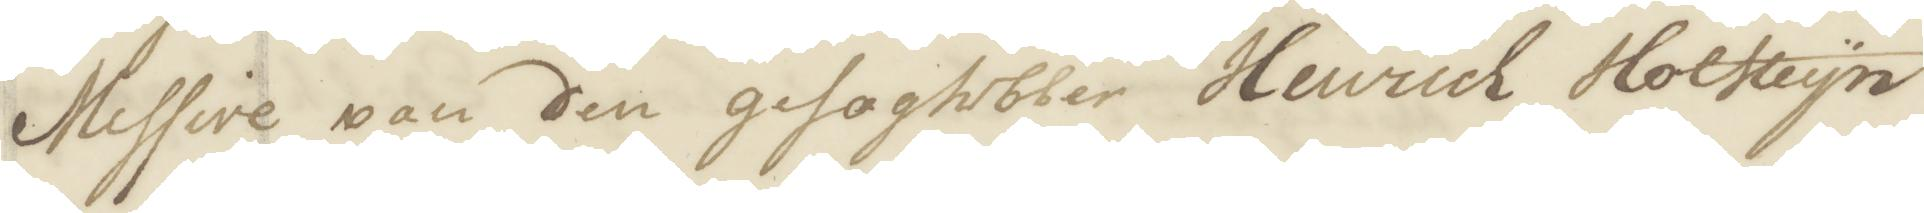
Missive van den gesaghebber Henrich Holsteijn
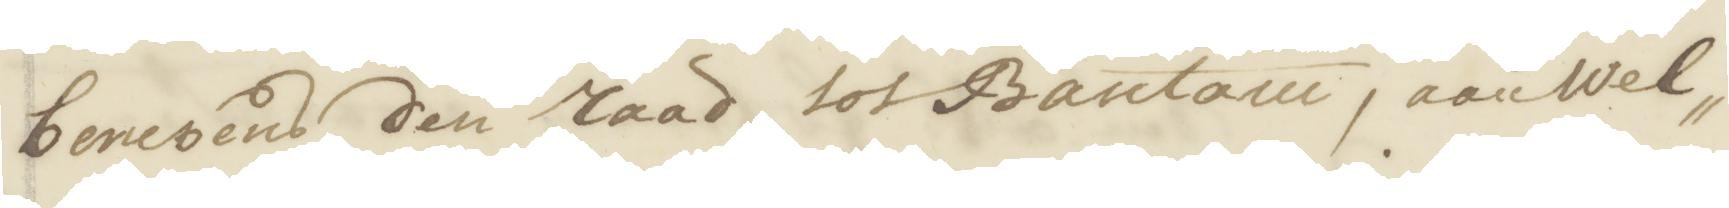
benevens den raad tot Bantam, aan wel„
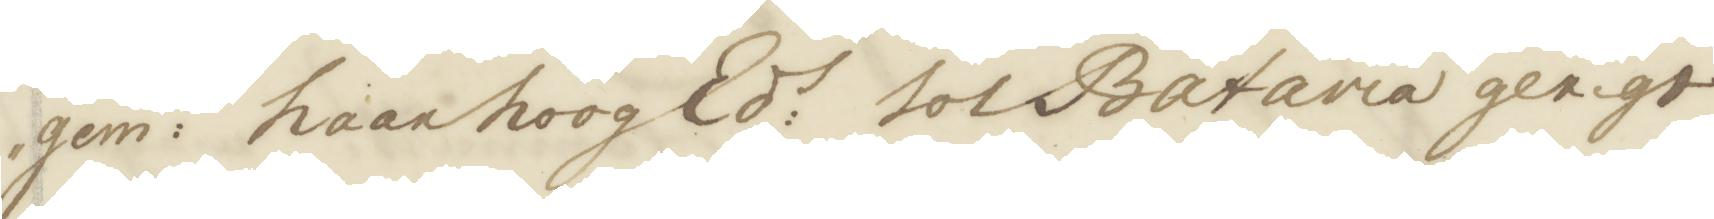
„gem: haar hoog Ed:s tot Batavia gerigt
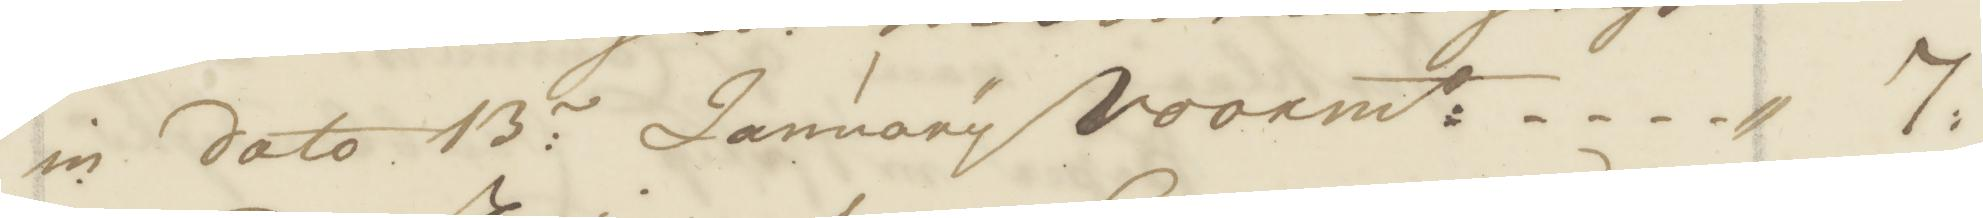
in dato 13:e Ianuarij voorm:t - - - - „ 7:
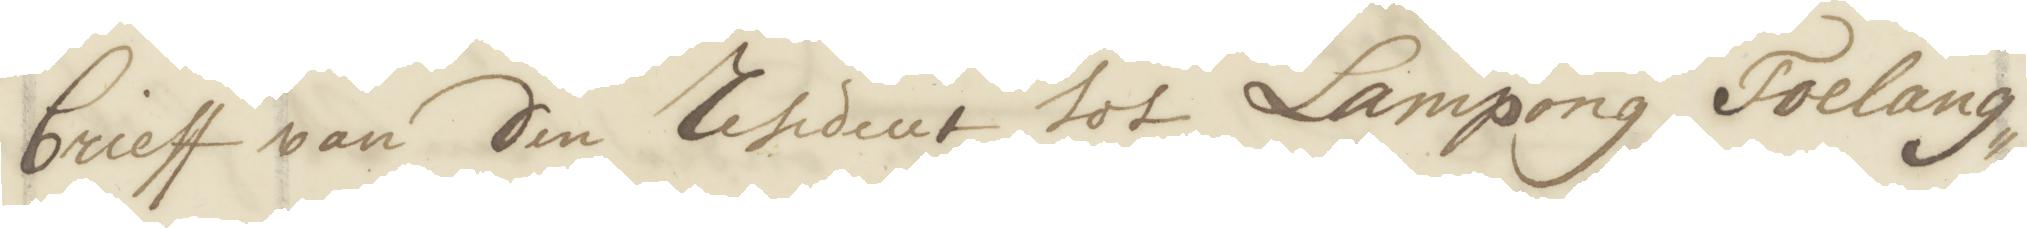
brieff van den Resident tot Lampong Toelang„
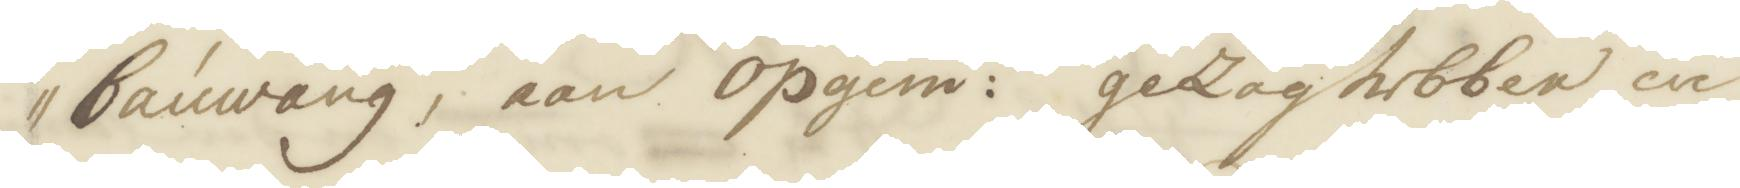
„bauwang, aan opgem: gezaghebber en
